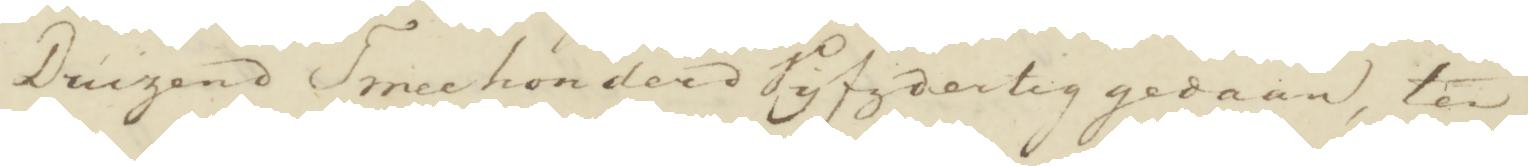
Duizend Twee honderd Vijfendertig gedaan, ten
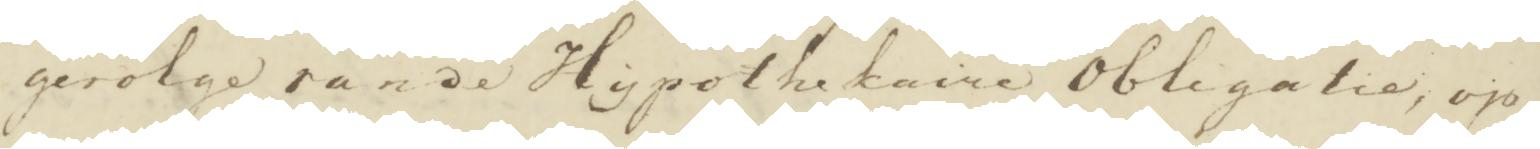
gevolge van de Hijpothekaire Obligatie, op
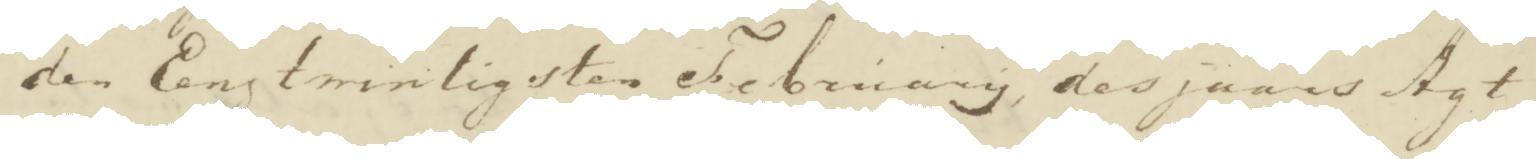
den Eenenen twintigsten Februarij, des jaars Agt
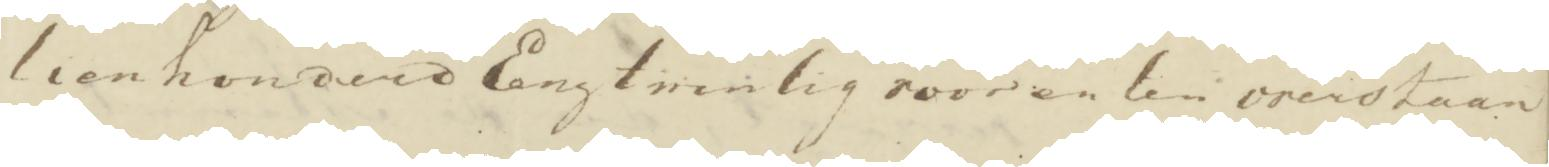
tien honderd Eenen twintig voor en ten Overstaan
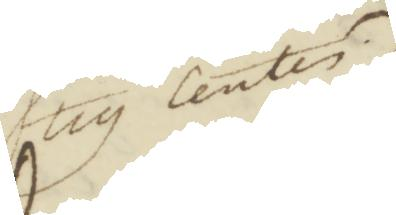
Tig Cents
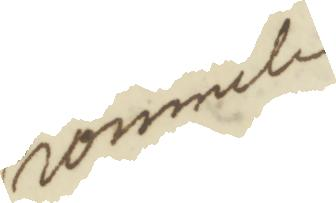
Crommeli
